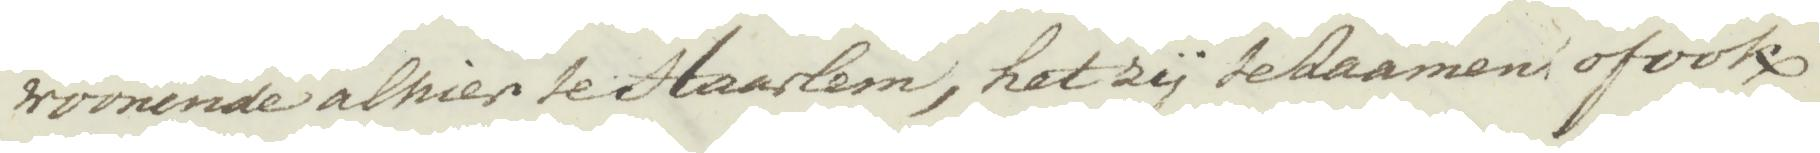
woonende alhier te Haarlem, het zij tezaamen; of ook
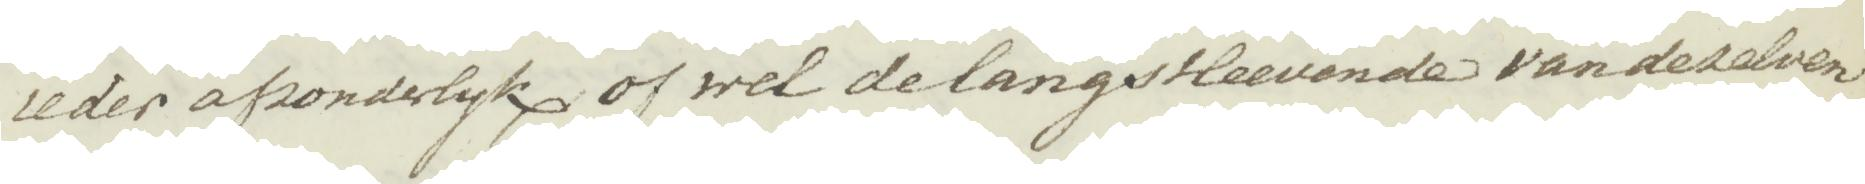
ieder afzondelyk of wel de langstleevende van dezelven
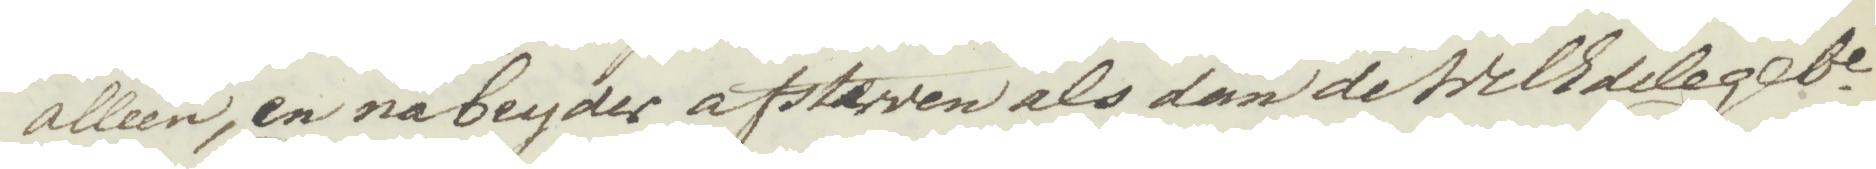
alleen, en na beyder afsterven als dan de Wel Edele geb.e
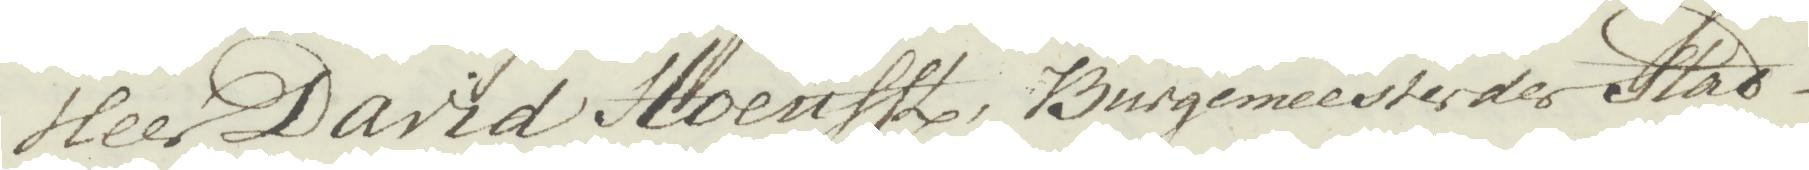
Heer David Hoeufft, Burgemeester der stad
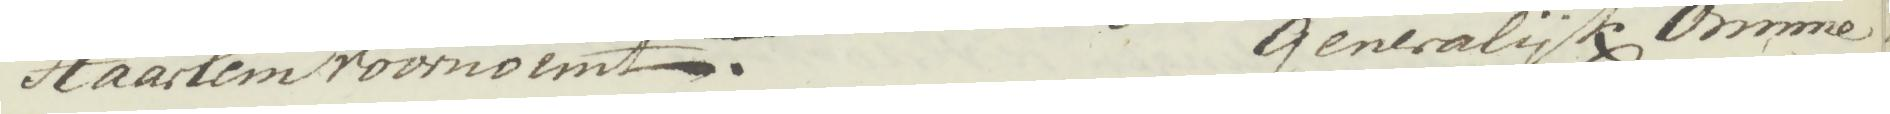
Haarlem voornoemt. generalijk Omme
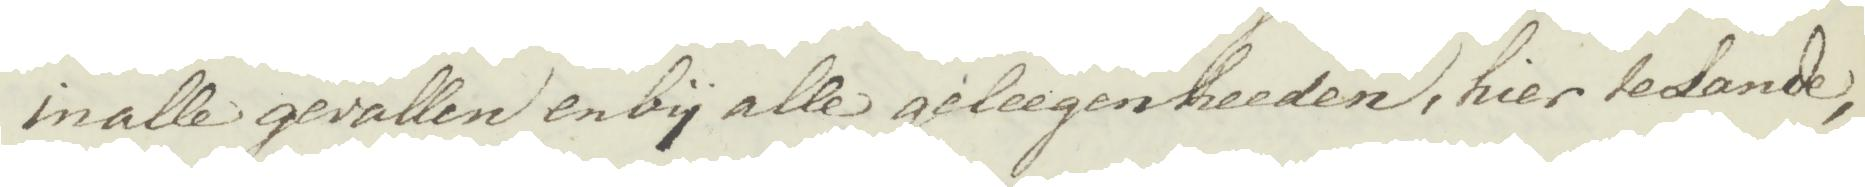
in alle gevallen en bij alle geleegenheeden, hier te lande,
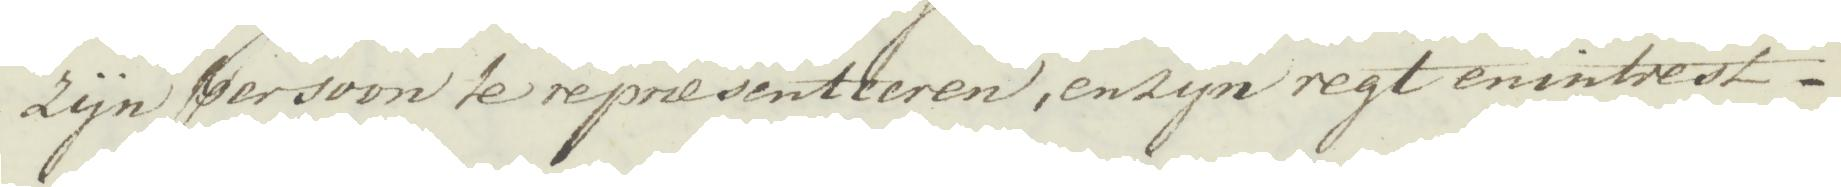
zijn persoon te representeeren, en zyn regt en intrest -
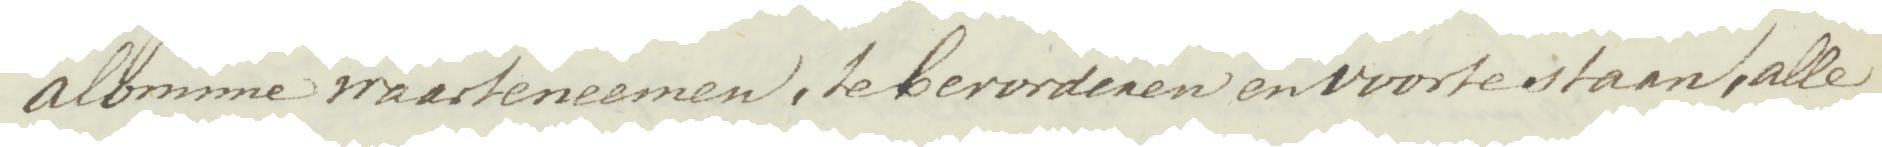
alomme waarteneemen, te bevorderen en voorte staan, alle
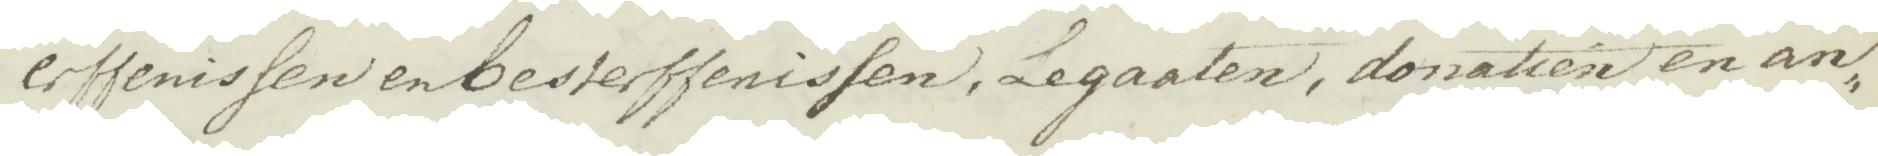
erffenissen en besterffenissen, legaaten, donatien en an„
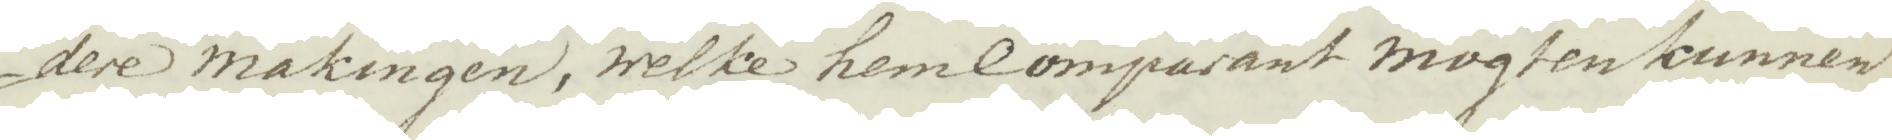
„dere makingen, welke hem comparant mogten kunnen
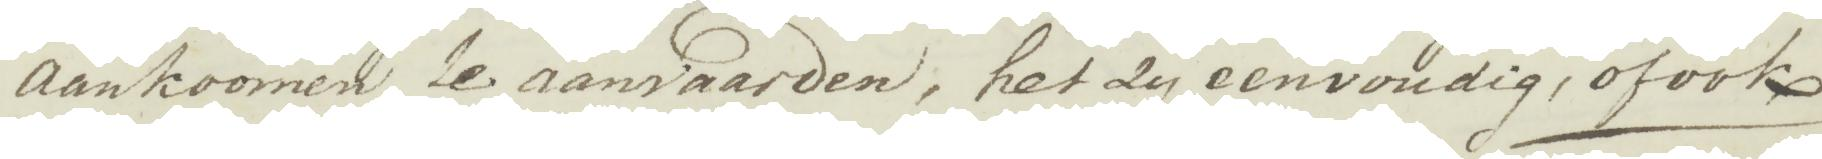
aankoomen, te aanvaarden, het zij eenvoudig, of ook
